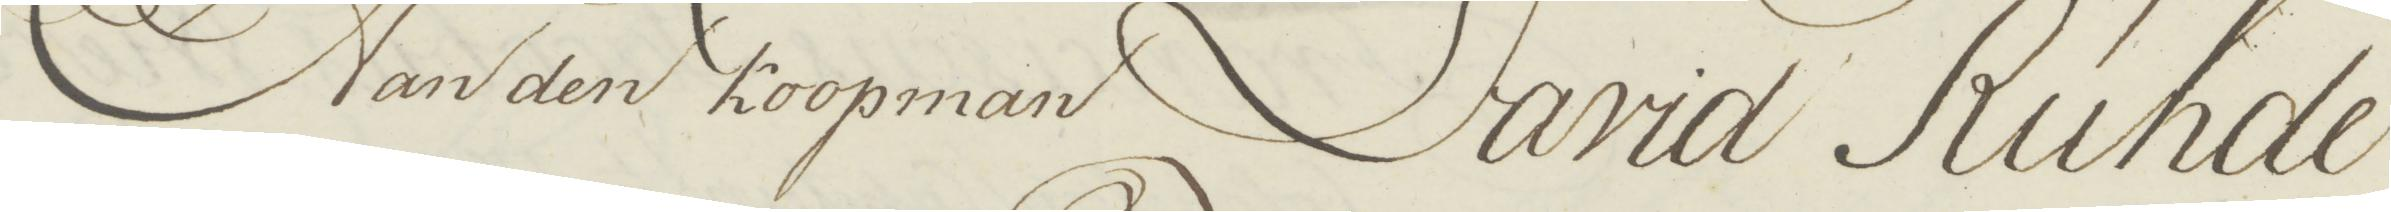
Aan den koopman David Ruhde
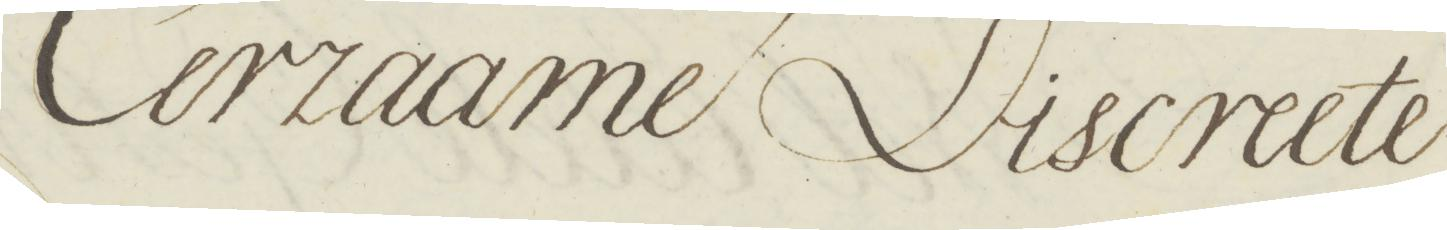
Eerzaame Discreete
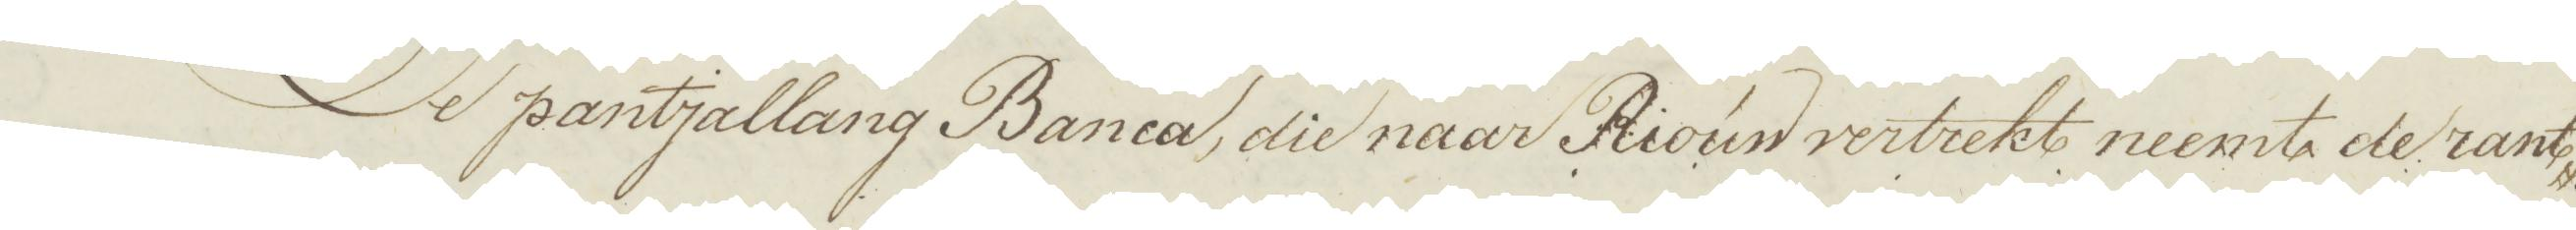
De pantjallang Banca, die naar Riouw vertrekt neemt de rant„
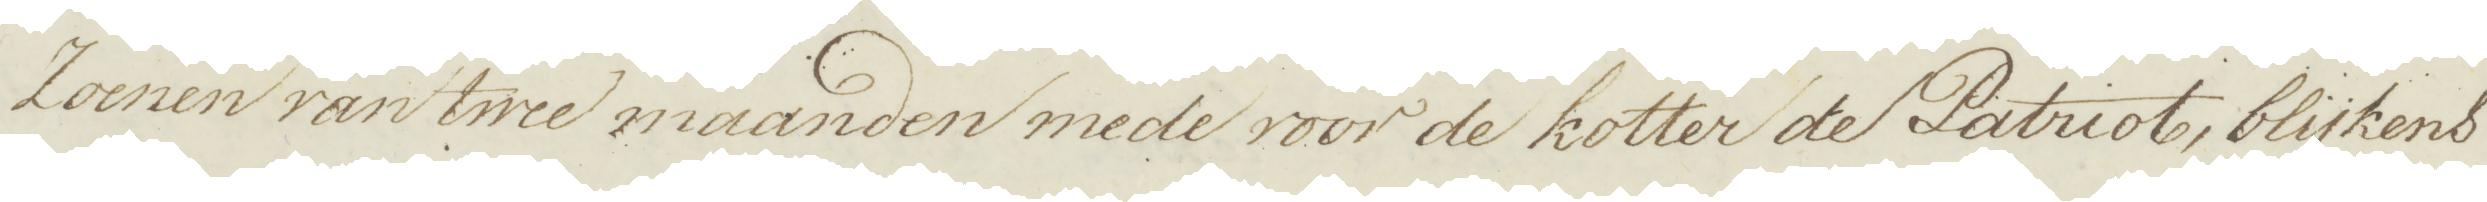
Zoenen van twee maanden mede voor de kotter de Patriot, blijkens
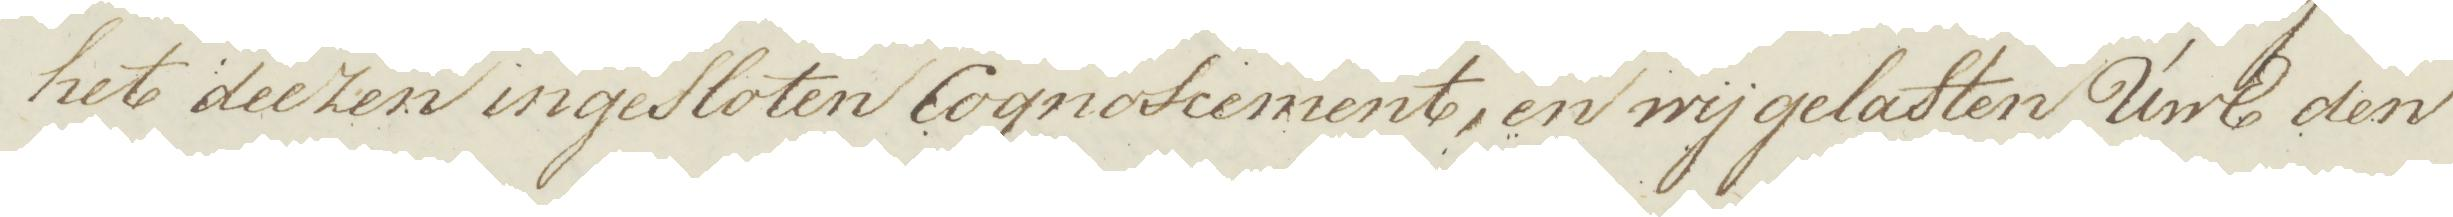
het deezen ingesloten Cognoscement, en wij gelasten UwE den
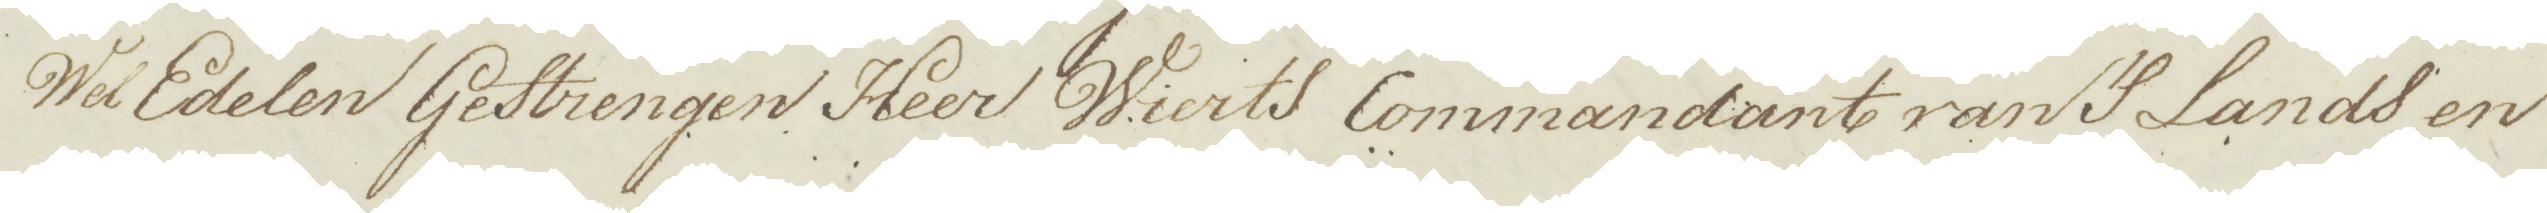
Wel Edelen Gestrengen Heer Wierts Commandant van 's Lands en
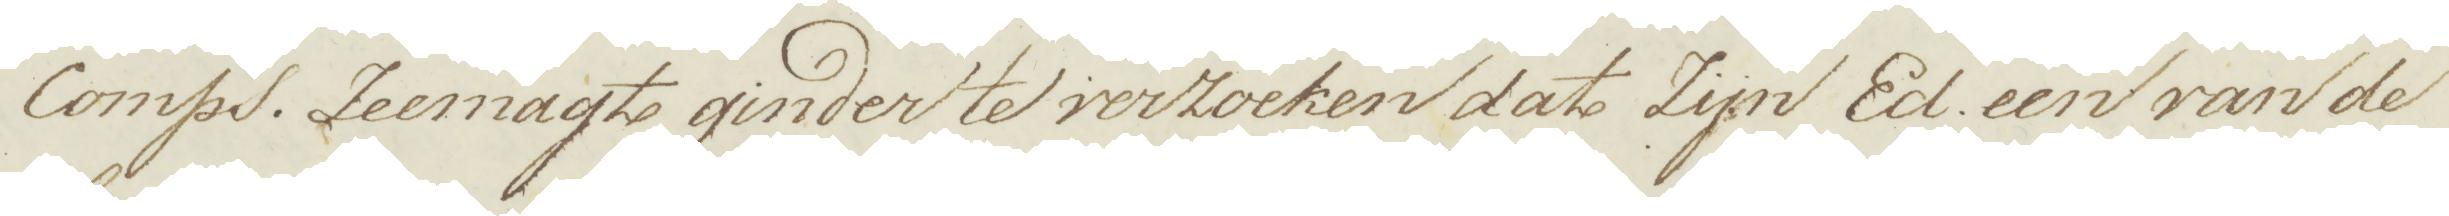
Comps. zeemagt ginder te verzoeken dat Zijn Ed. een van de
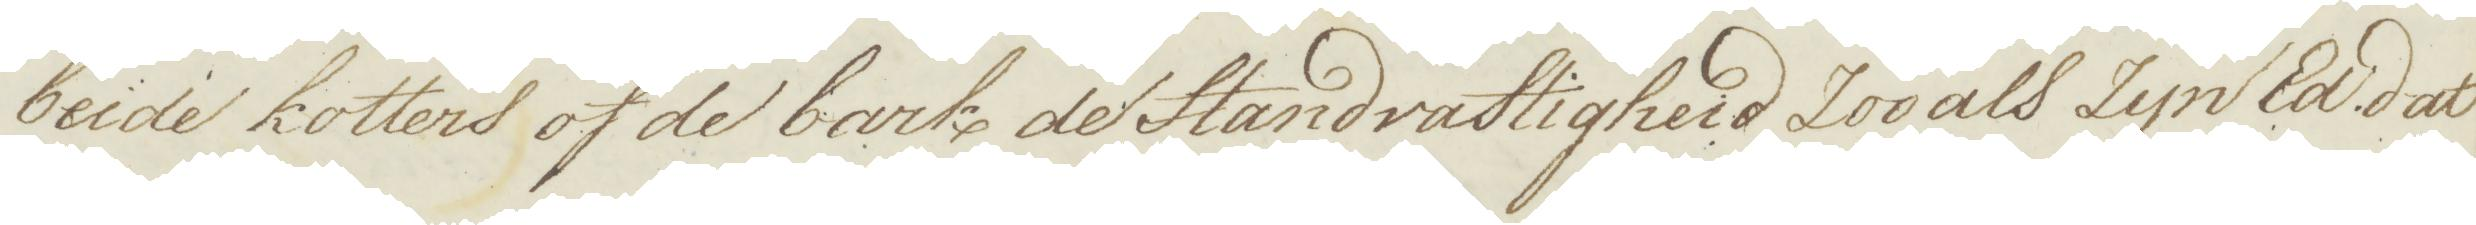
beide kotters of de bark de Standvastigheid Zoo als Zijn Ed: dat
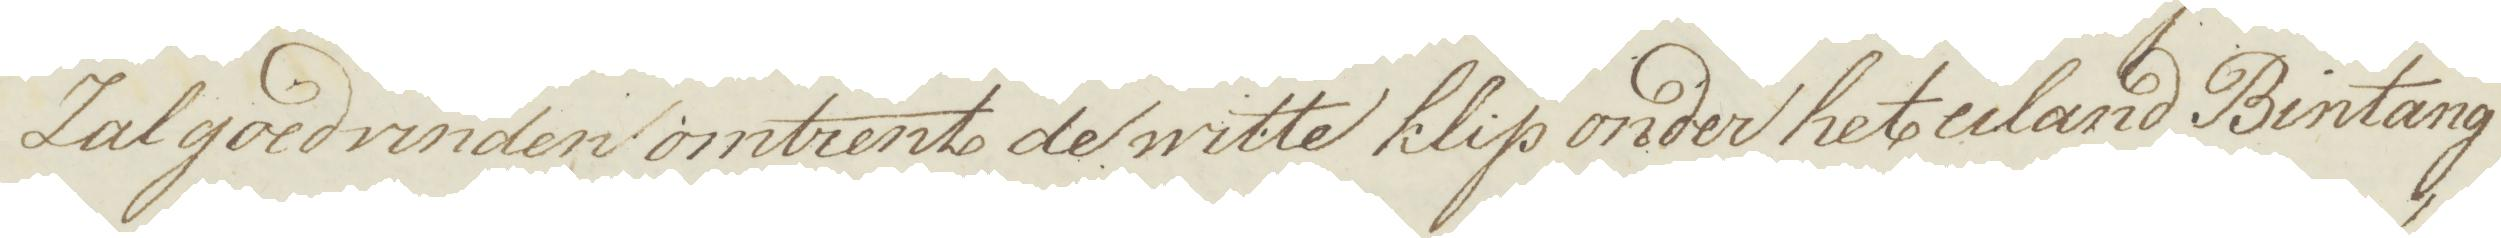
Zal goedvinden omtrent de witte klip onder het eiland Bintang
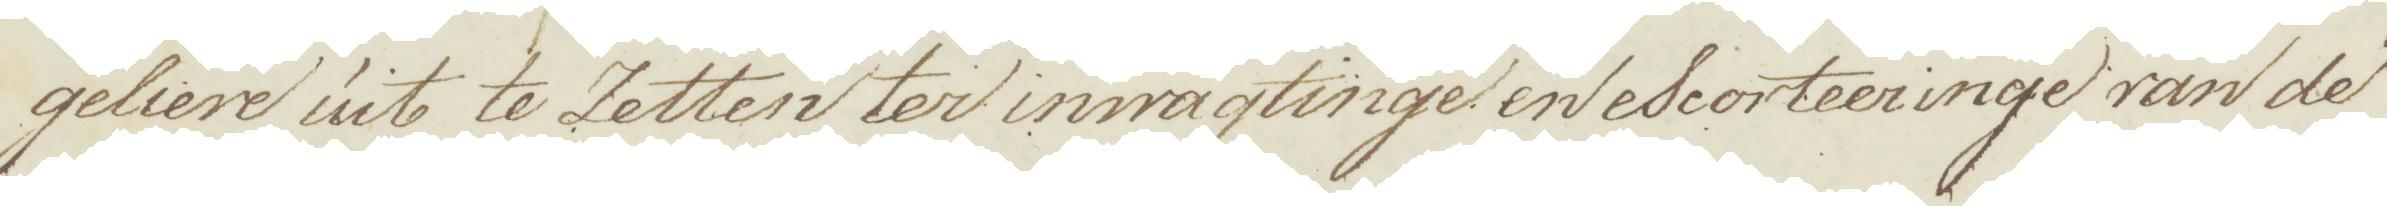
gelieve uit te Zetten ter inwagtinge en escorteeringe van de
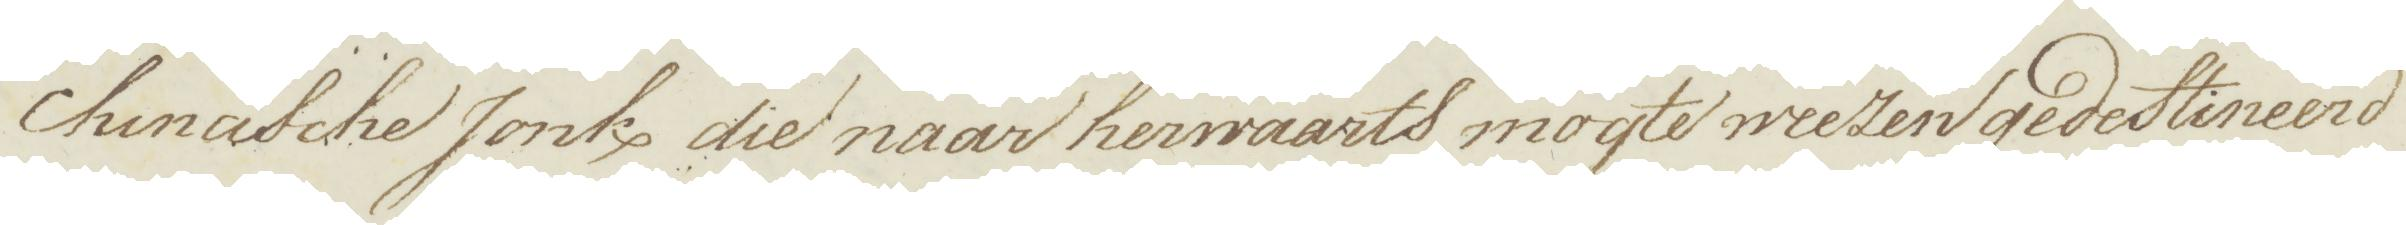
Chinasche Jonk die naar herwaarts mogte weezen gedestineerd
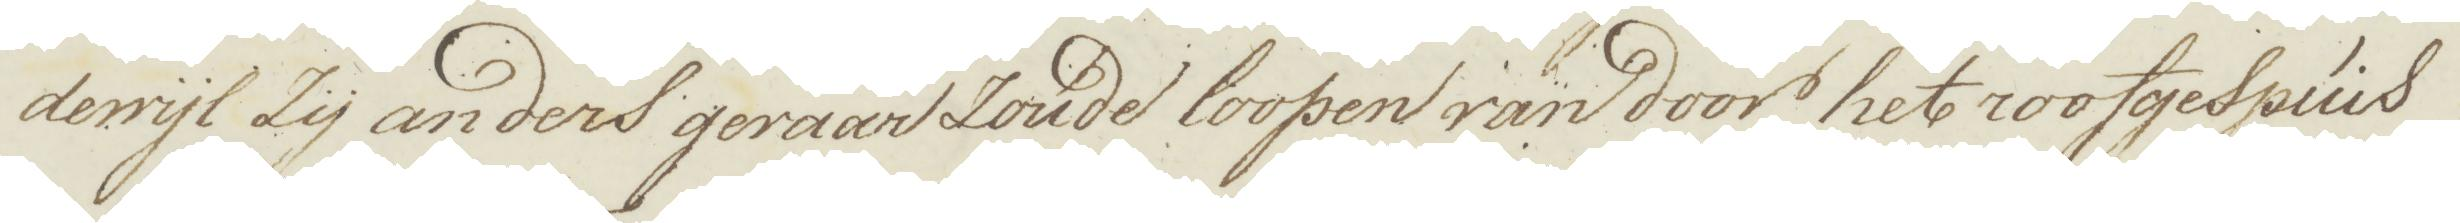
dewijl Zij anders gevaar Zoude loopen van door het roofgespuis
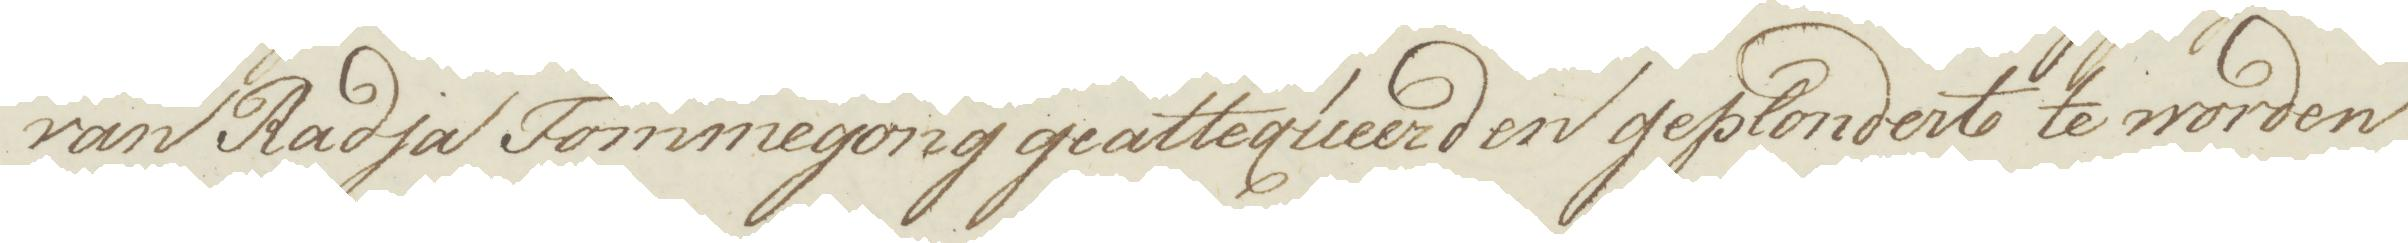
van Radja Tommegong geattequeerd en geplondert te worden
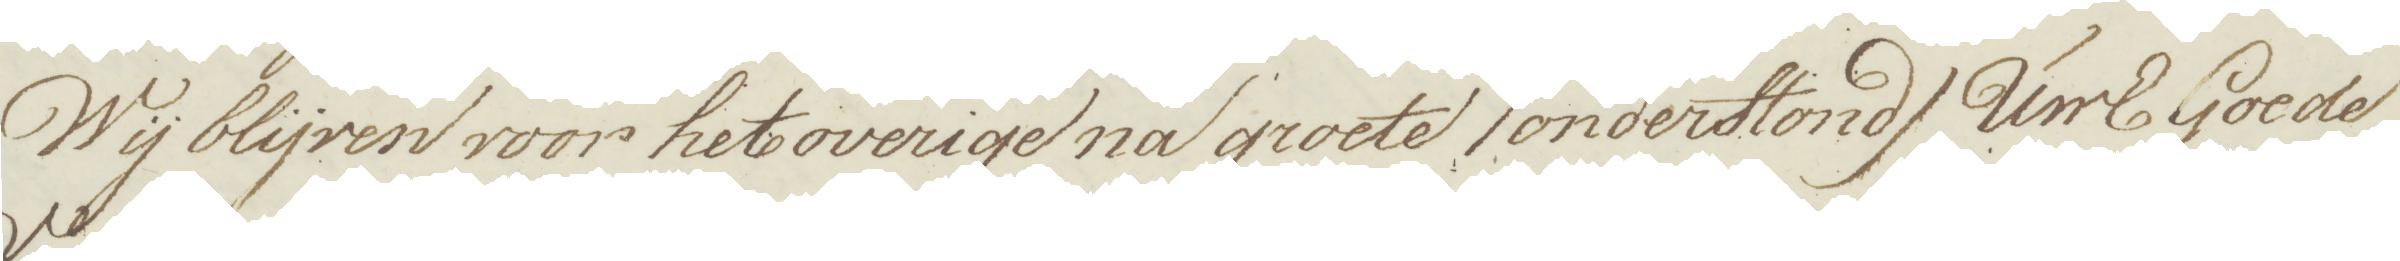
Wij blijven voor het overige na groete /onderstond/ UwE Goede
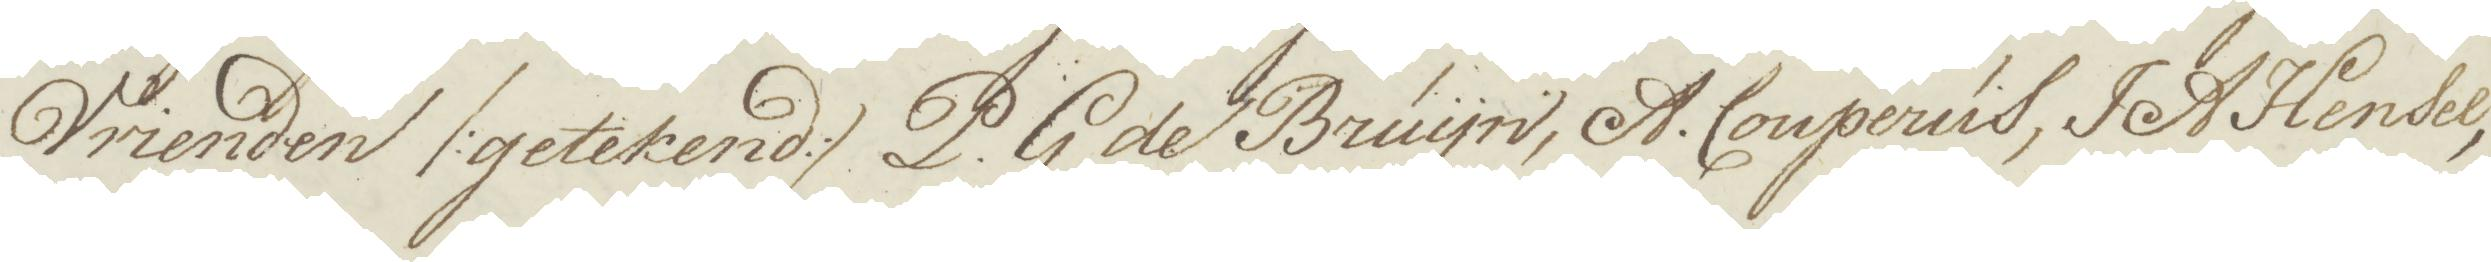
Vrienden /:getekend:/ P. G de Bruijn, A. Couperus, I A Hensel,
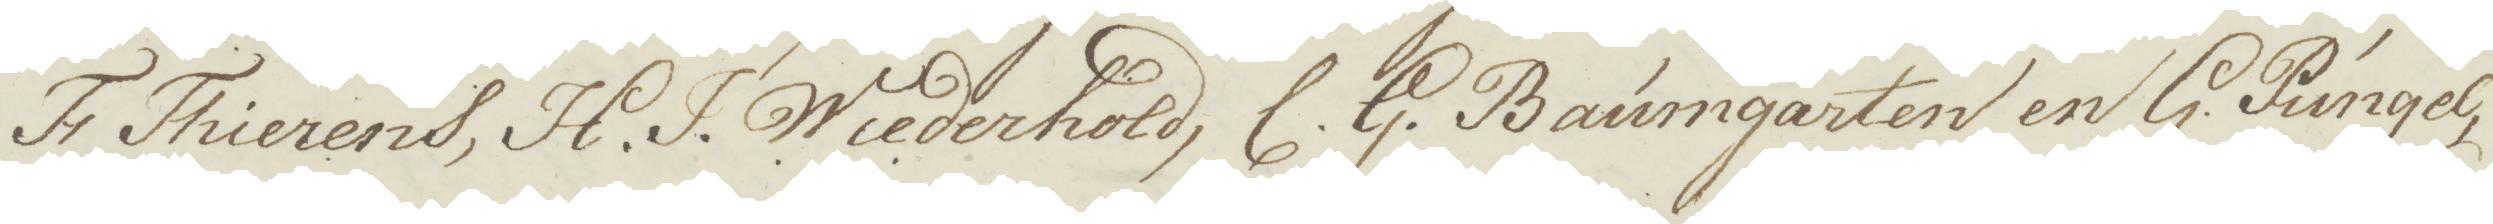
F Thierens, H. J. Wiederhold, C. G. Baumgarten en G. Pungel,
